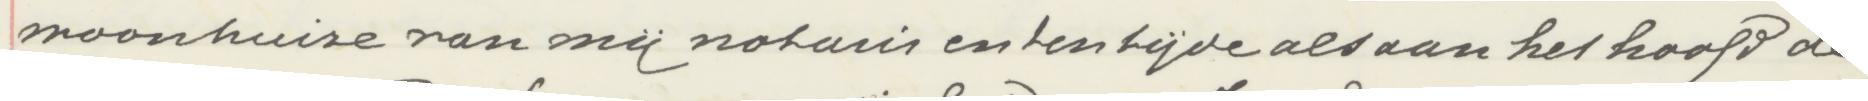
woonhuize van mij notaris en ten tijde als aan het hoofd de
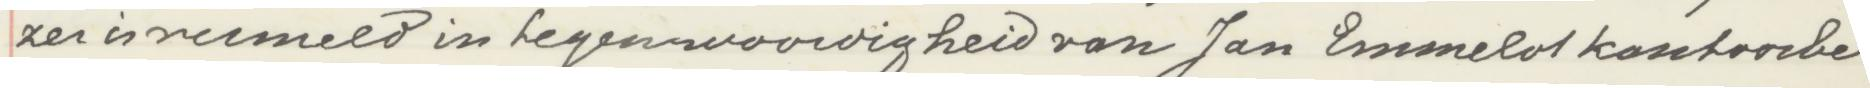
zes is vermeld in tegenwoordigheid van Jan Emmelos kantoorbe
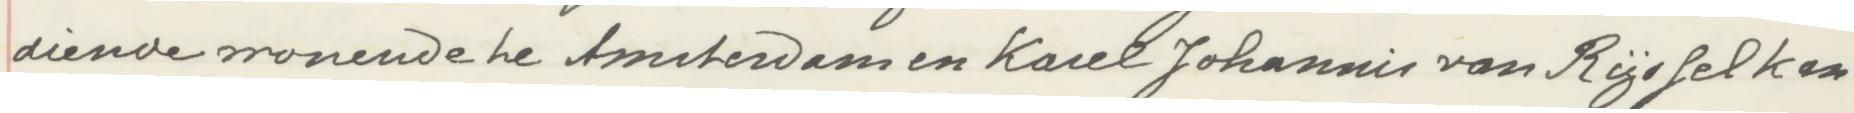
diende wonende te Amsterdam en Karel Johannes van Rijssel kan
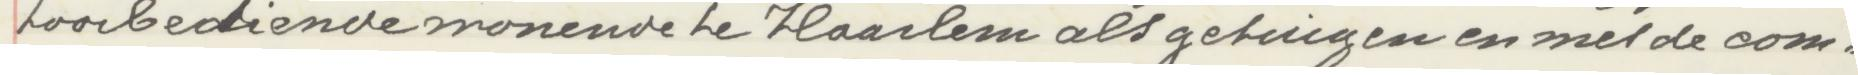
toorbediende wonende te Haarlem als getuigen en met de com„
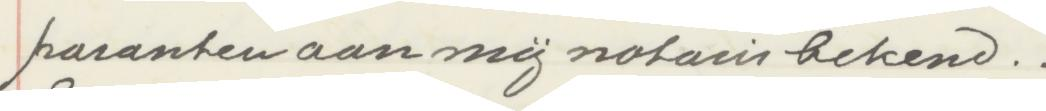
paranten aan mij notaris bekend.
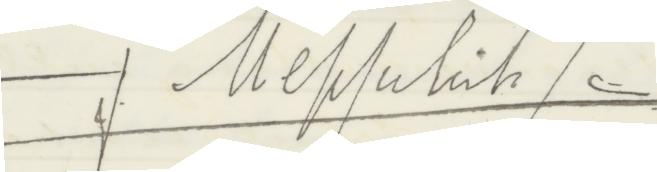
G. Meppelink J=r
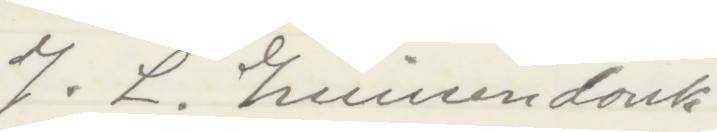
J. L. Zuurendonk
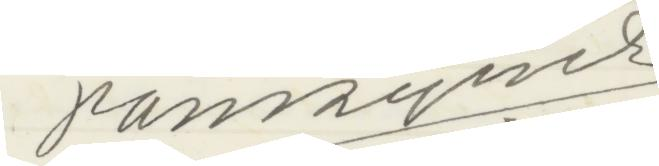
vanvrijnsch
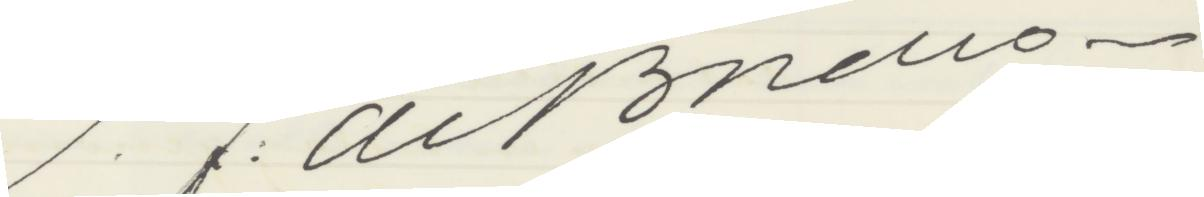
P. J: deBrdes -
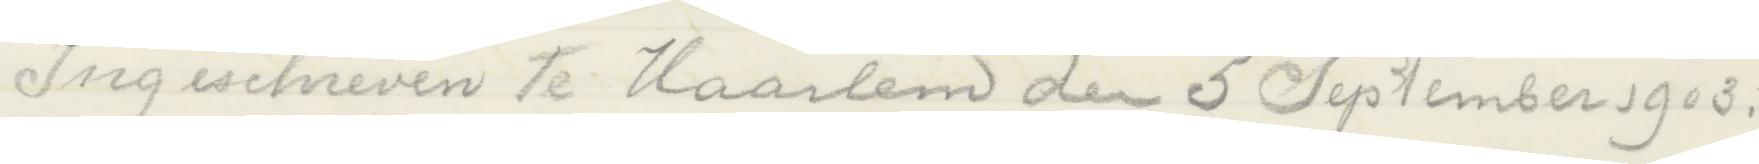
Ingeschreven te Haarlem den 5 September 1905:
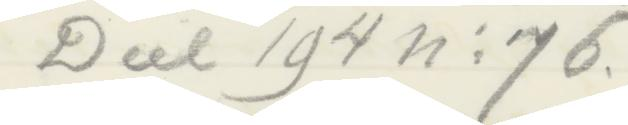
Deel 194 n: 76.
